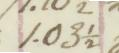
1.03½
